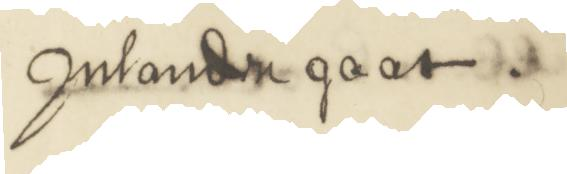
Jnlander gaat.
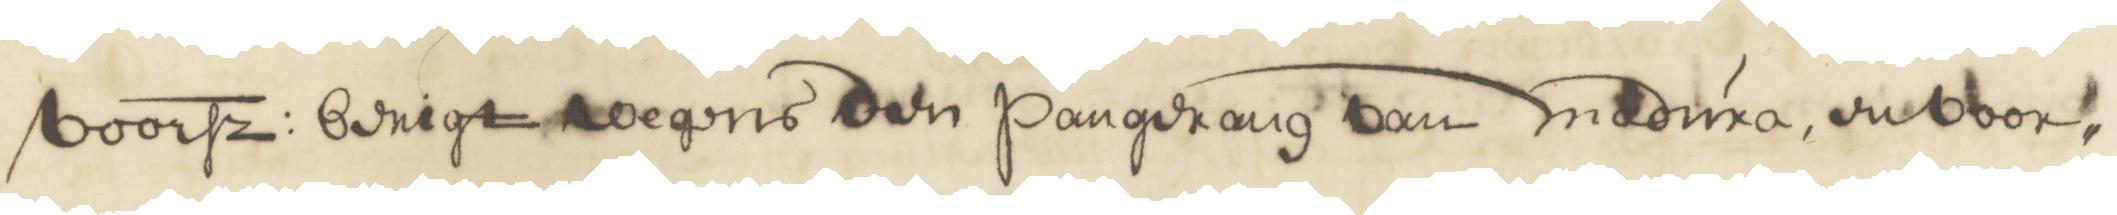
voorsz: berigt wegens den pangerang van madura, en voor„
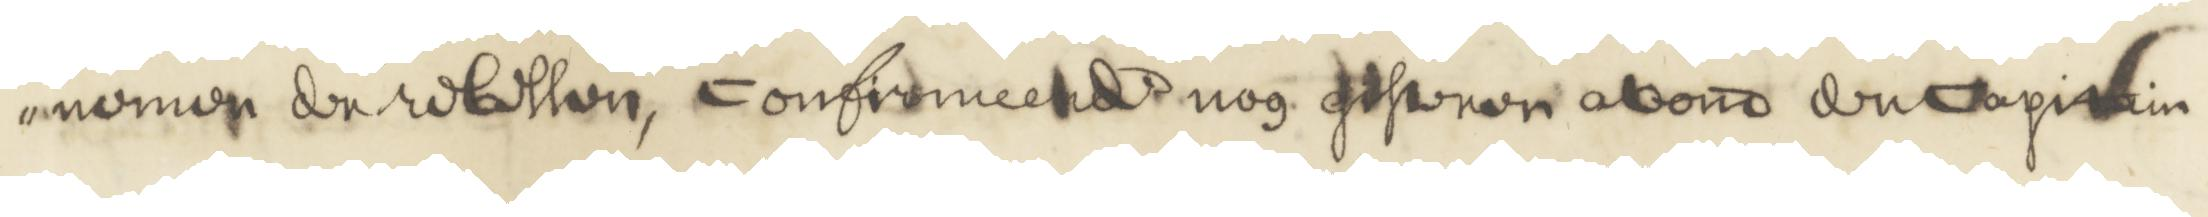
„nemen der rebellen, confirmeende nog gisteren avond den capitain
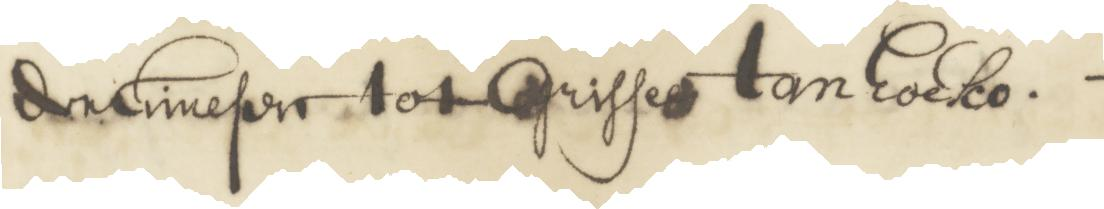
der chinesen tot grissee tan hoeko.
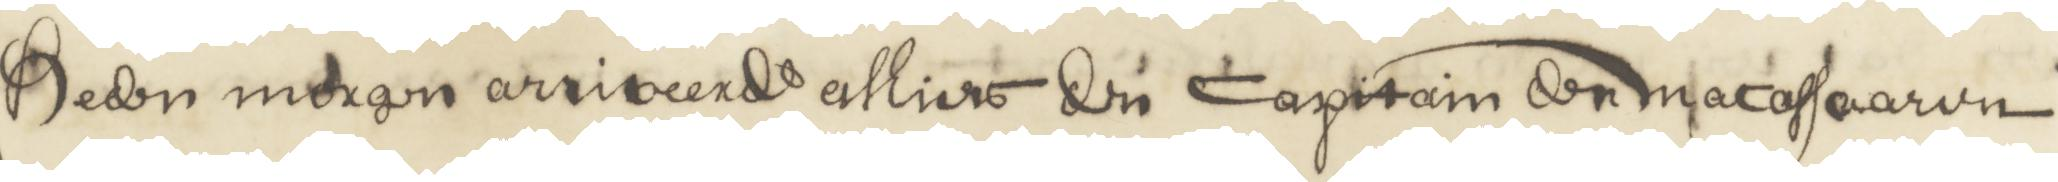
Heden morgen arriveerde alhier den capitain den macassaaren
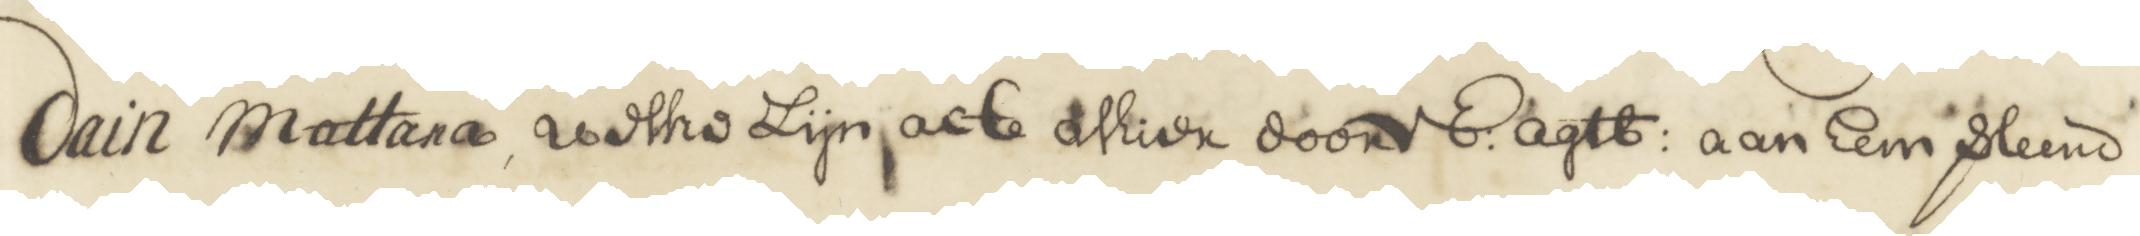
dain mattara, welke zijn acte alhier door VE: agtb: aan hem verleend
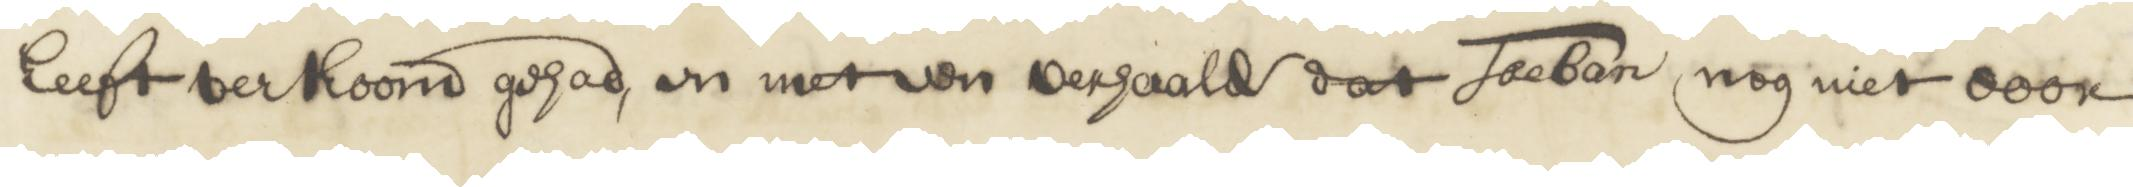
heeft verthoond gehad, en met een verhaalde dat Toeban nog niet door
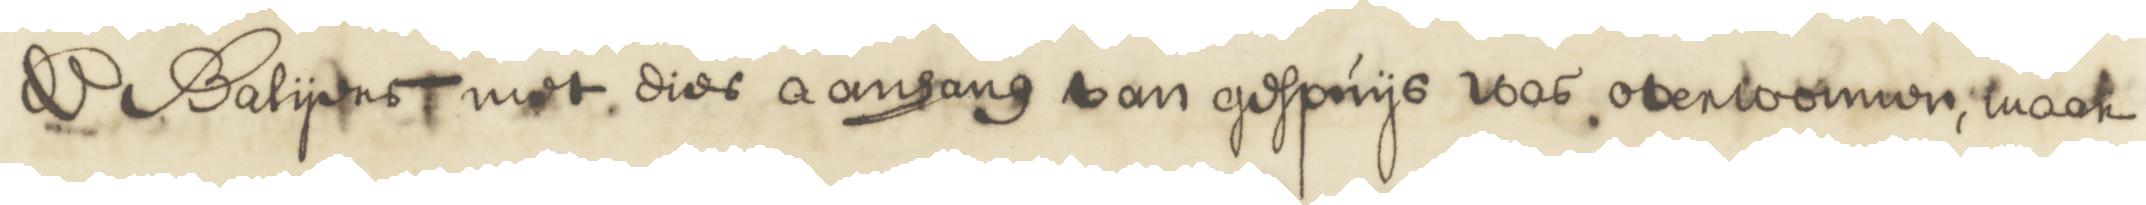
de Balijens met dies aanhang van gespuijs was overwonnen, maar
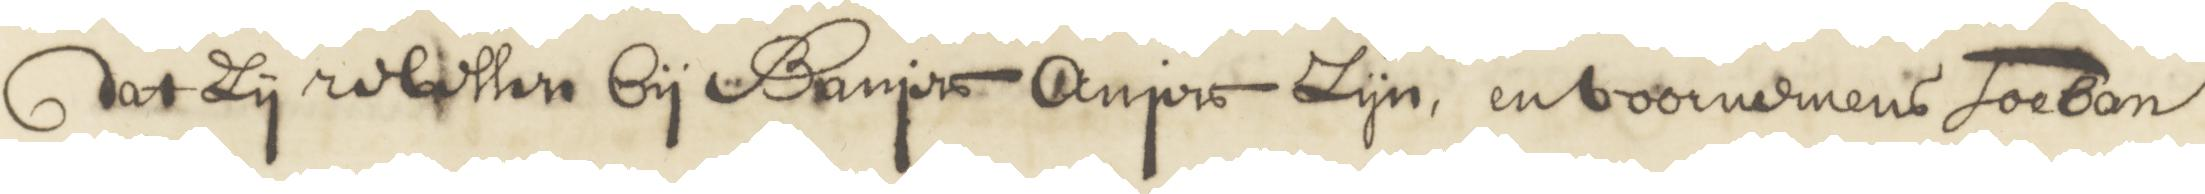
dat zij rebellen bij Banjer Anjer zijn, en voornemens Toeban
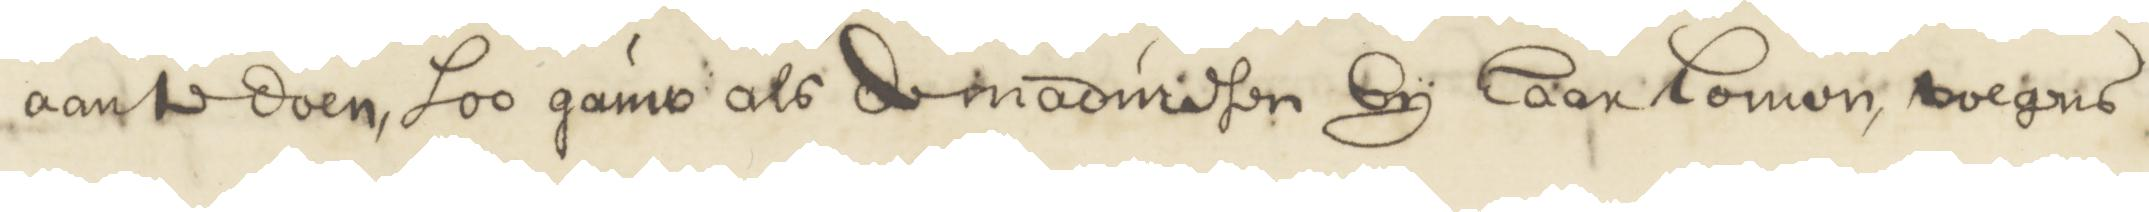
aan te doen, soo gauw als de maduresen bij haar komen, volgens
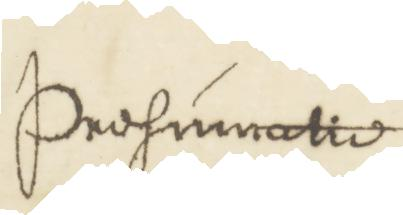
presumatie
